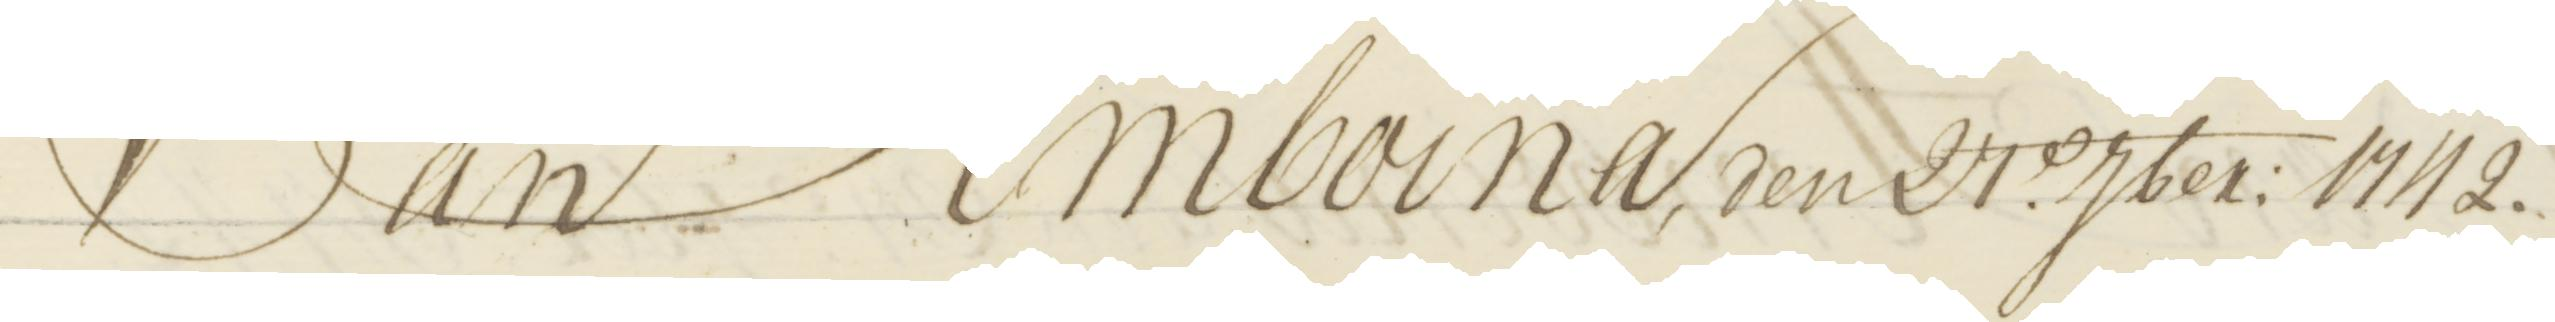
Van Amboina, den 27:e 7ber: 1742.
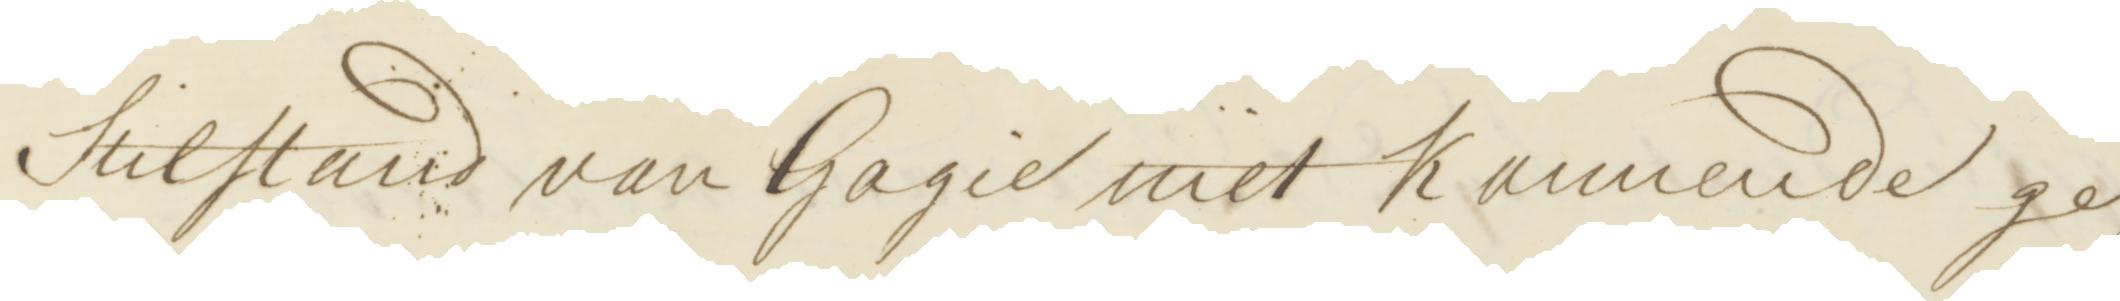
Stilstand van Gagie niet kunnende ge
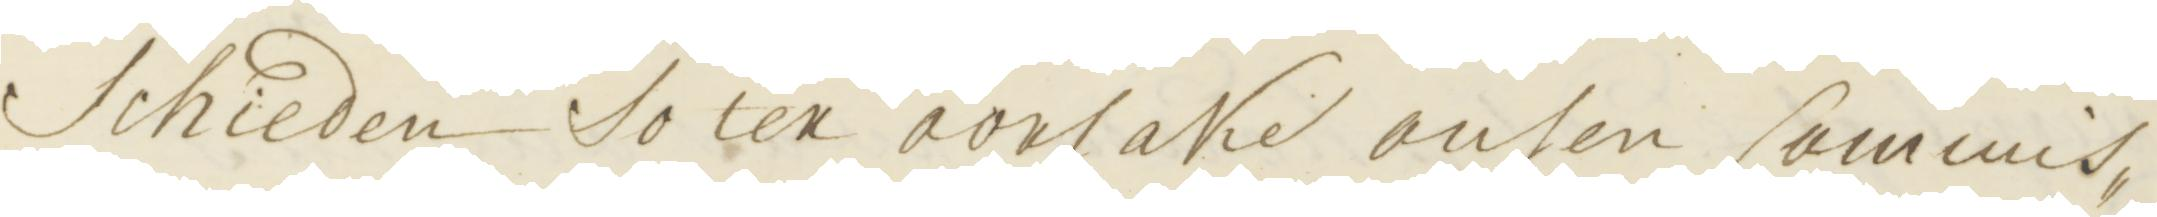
Schieden So ter oorsake onsen Commis„
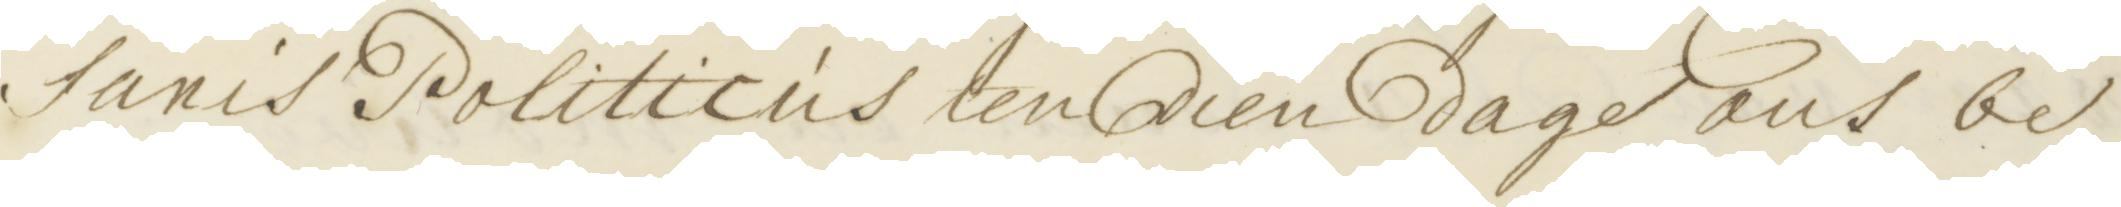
Saris Politicus ten dien dage ons be
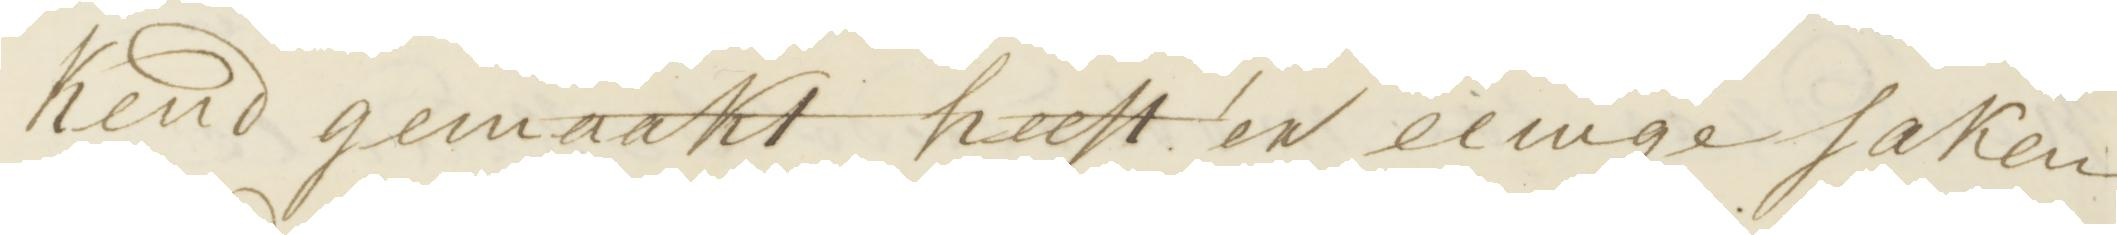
Kend gemaakt heeft er eenige Saken
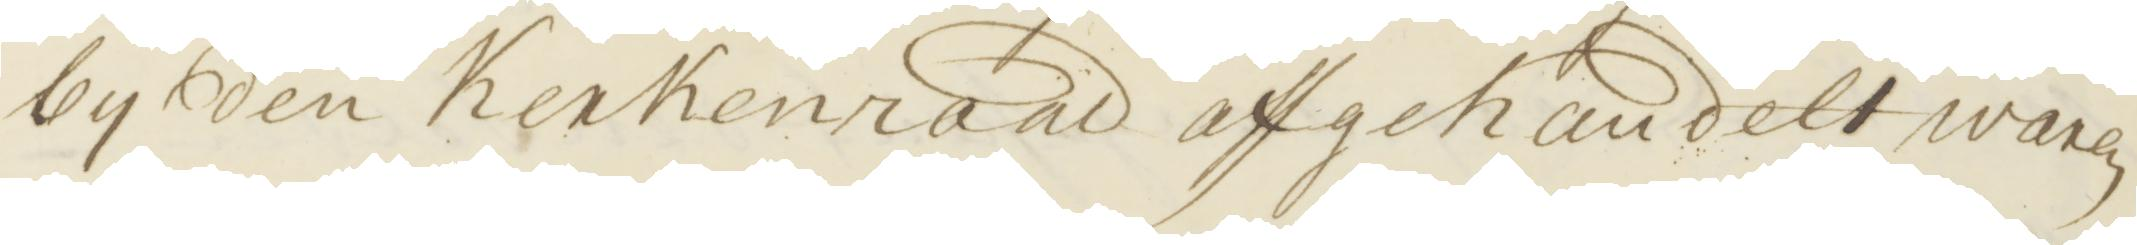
by den kerkenraad affgehandelt waren
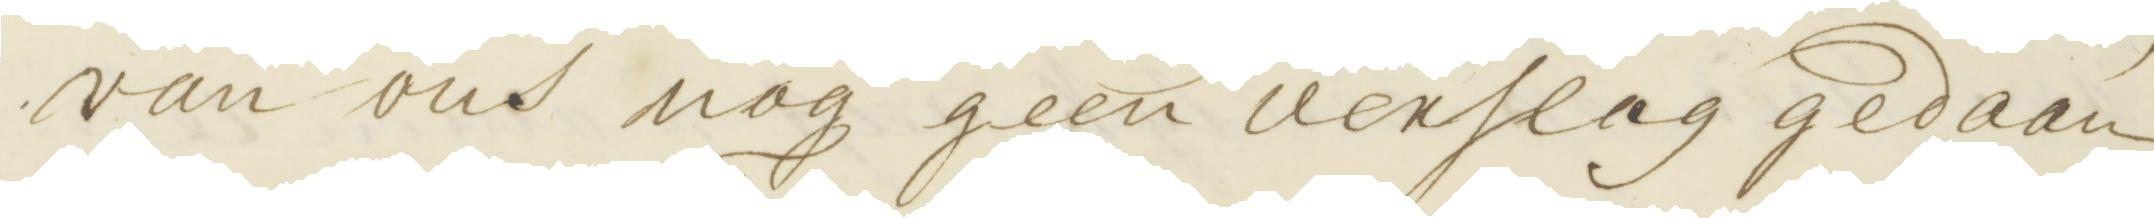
van ons nog geen verslag gedaan
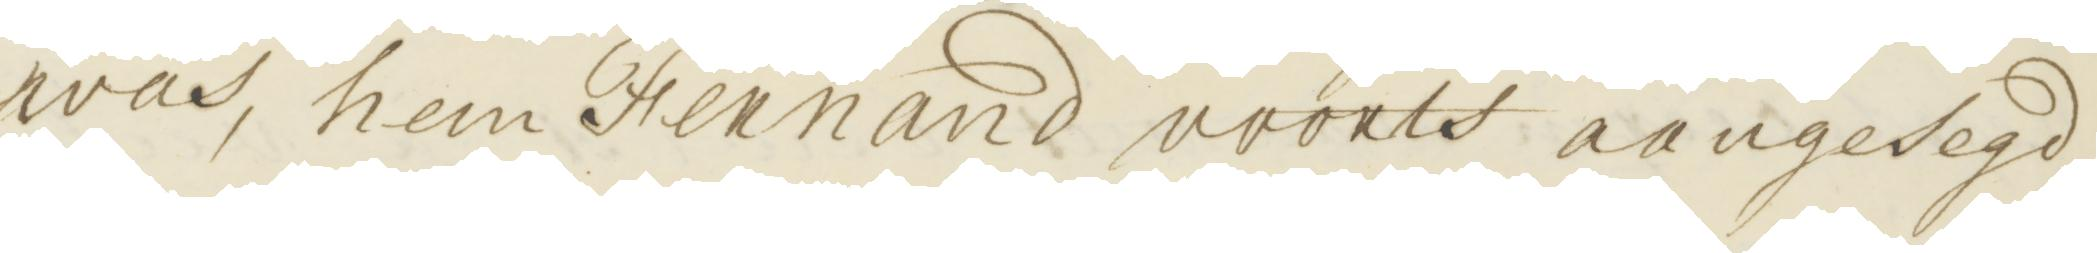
was, hem Fernand voorts aangesegd,
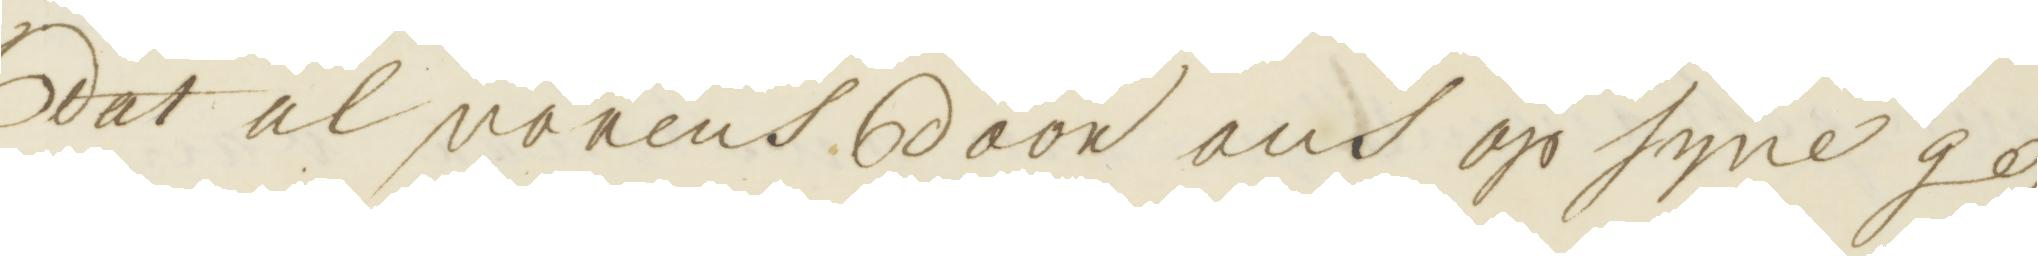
dat al vorens door ons op syne ge
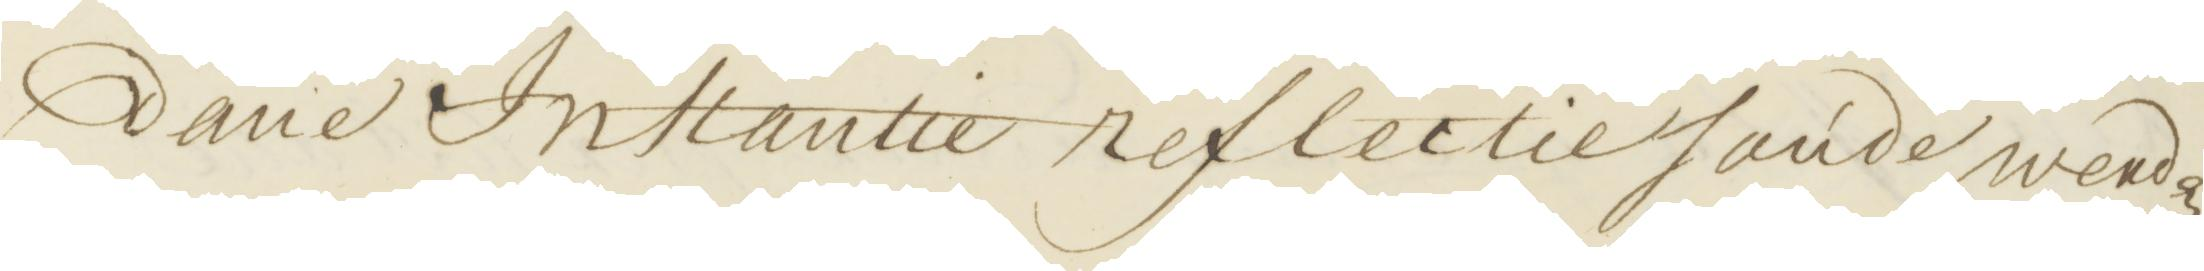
dane Instantie reflectie Soude werden
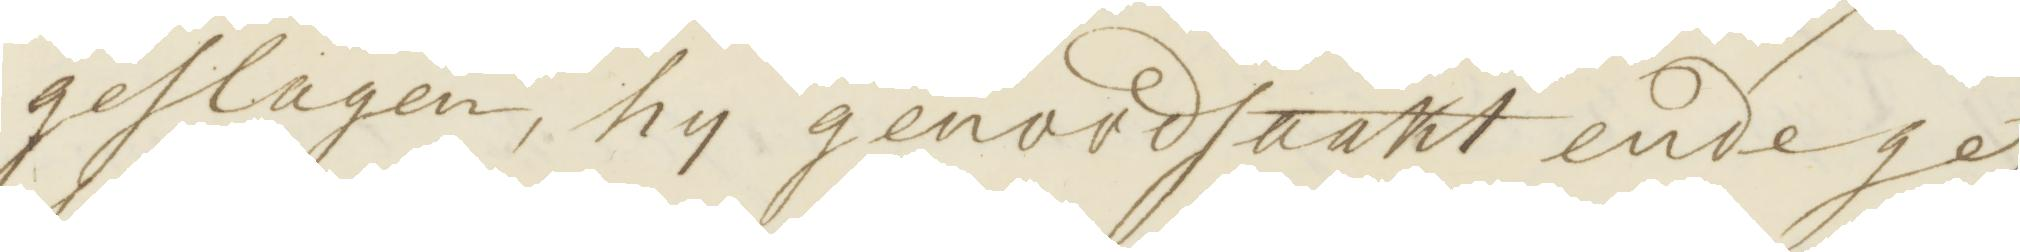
geslagen, hy genoodsaakt ende ge
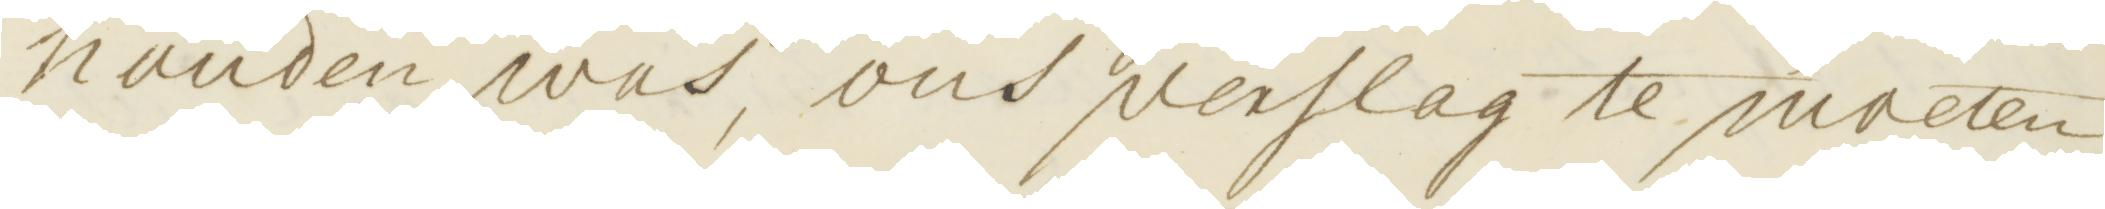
houden was, ons verslag te moeten
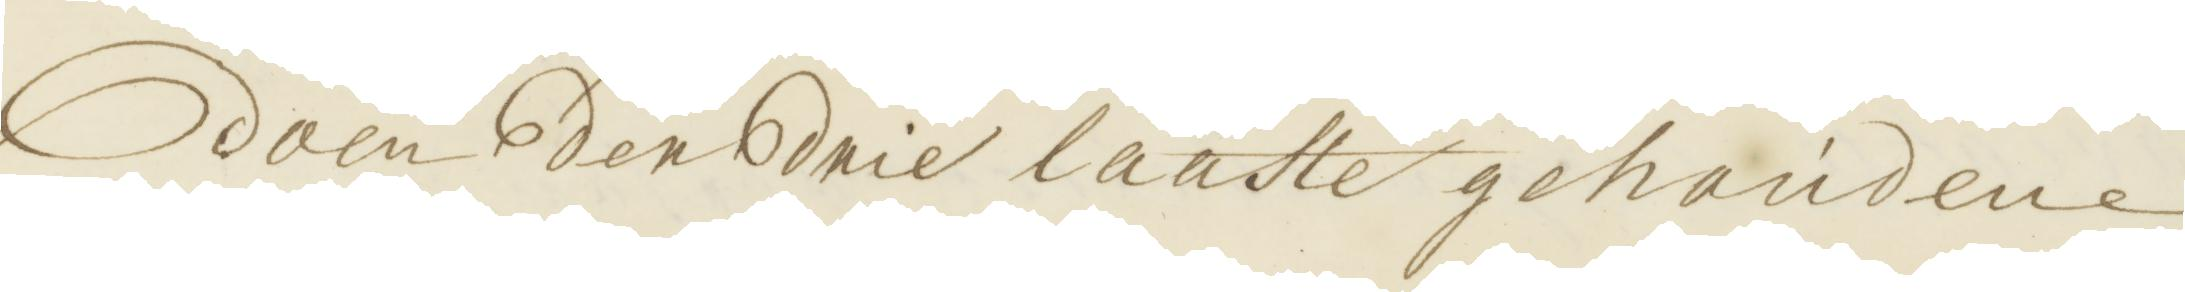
doen der drie laaste gehoudene
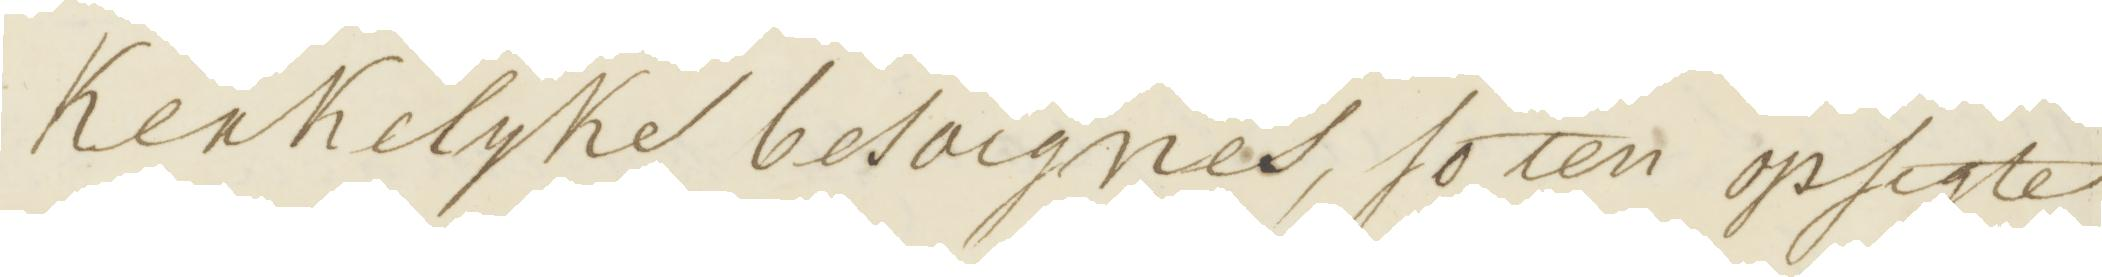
Kerkelyke besoignes, so ten opsigte
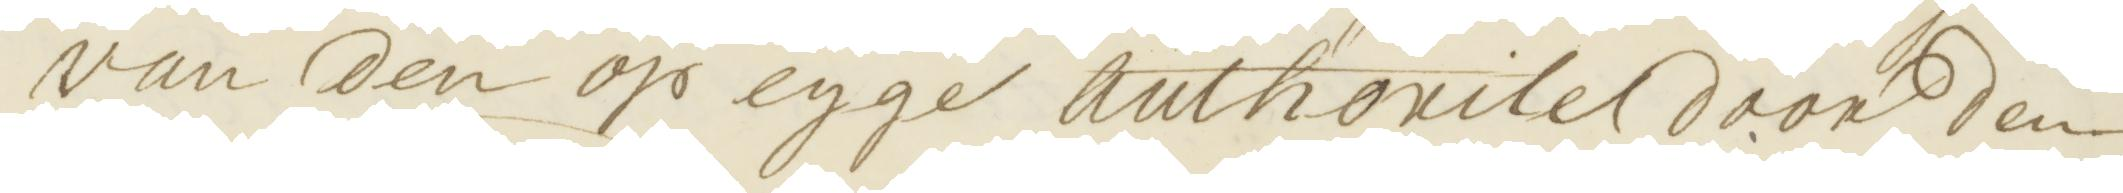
van den op eyge authorite door den
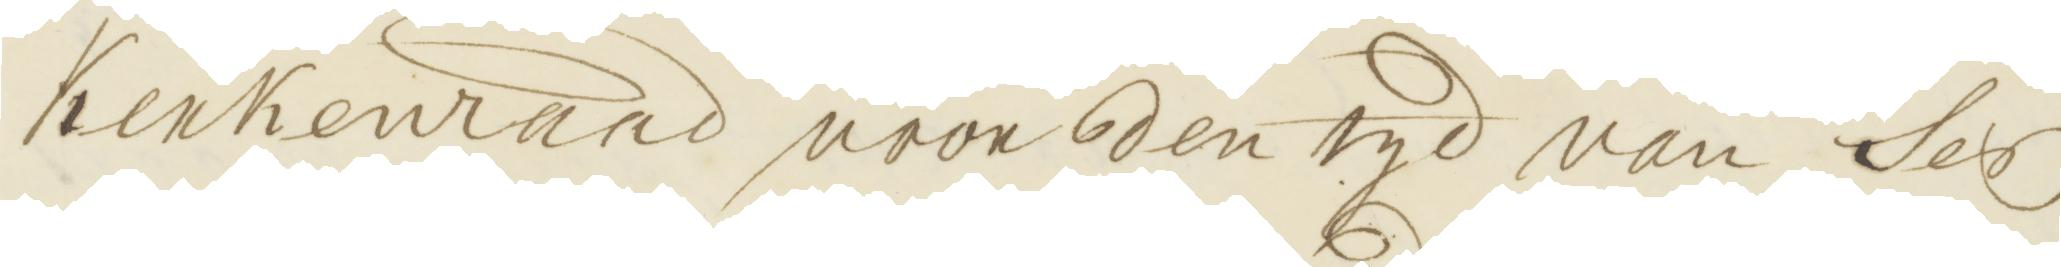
Kerkenraad voor den tyd van Ses
